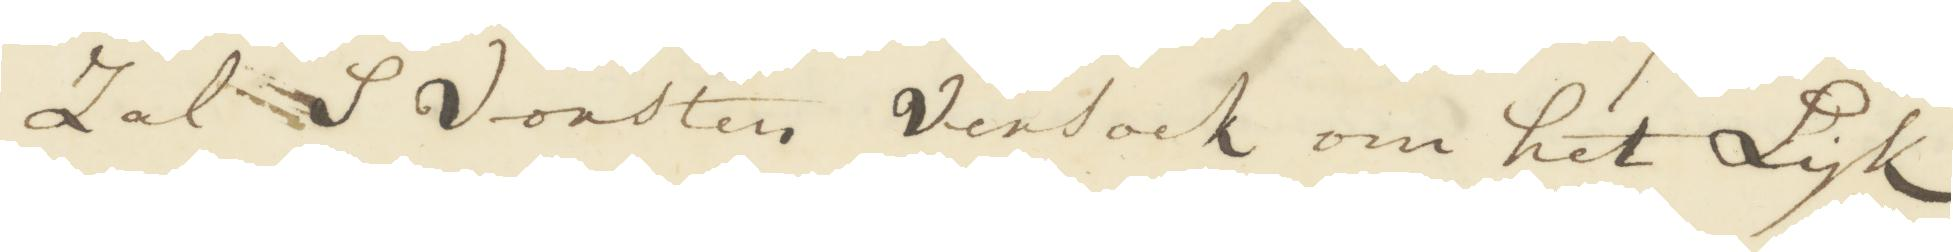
zal s vorsten versoek om het Lijk
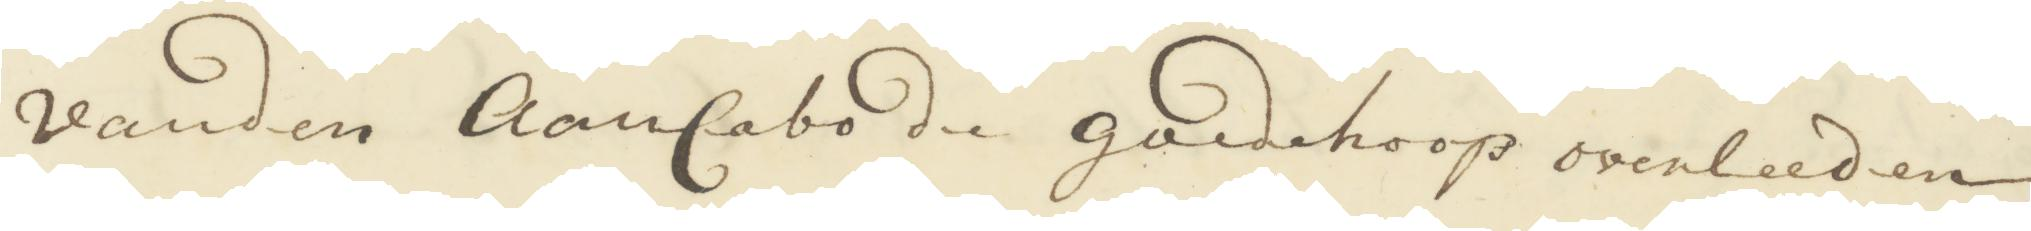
vanden aancabo de goedehoop overleeden
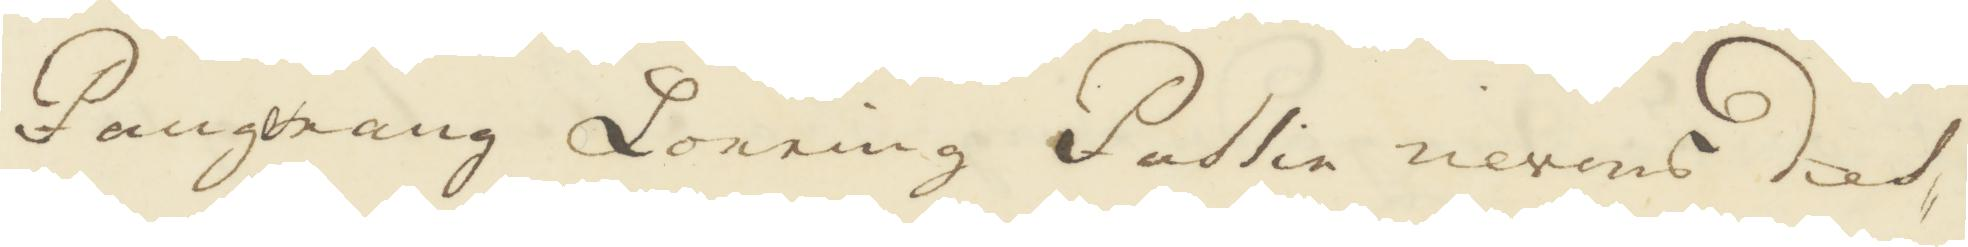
Pangerang Lorring Passir nevens des„
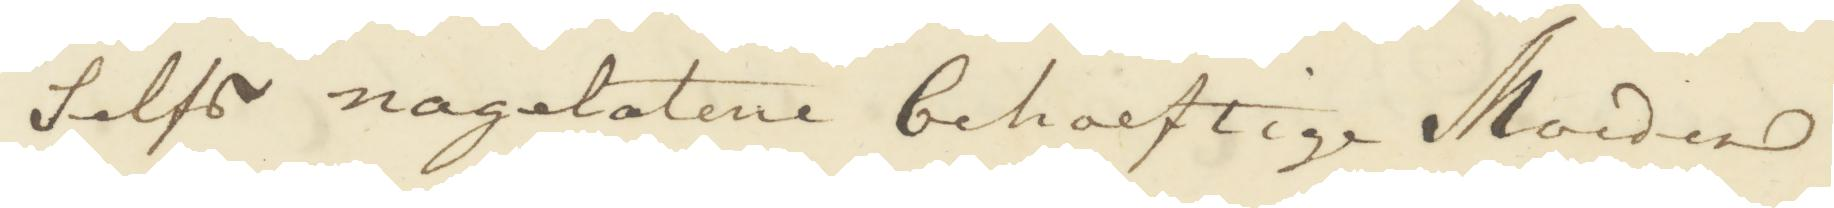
selfs nagelatene behoeftige Moeder
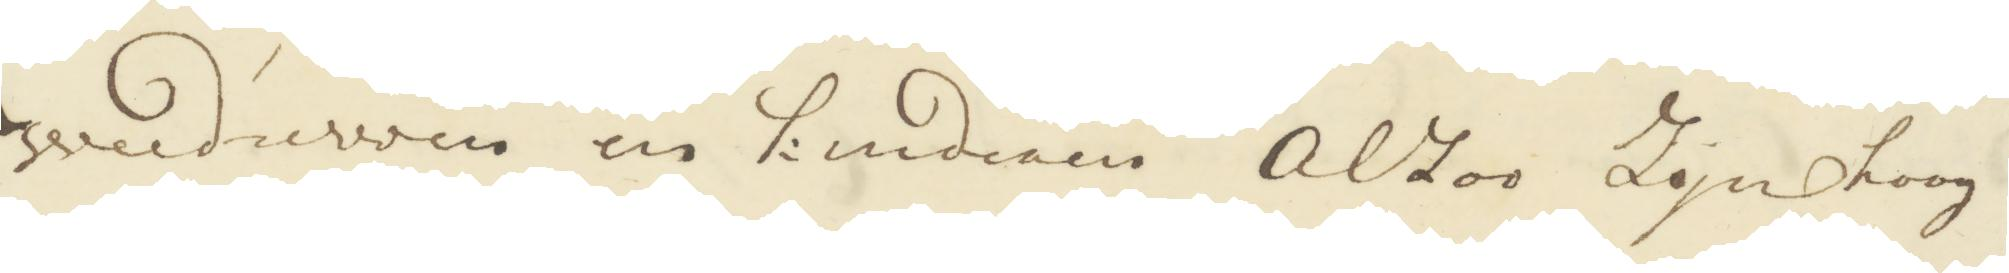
weeduwen en kinderen alzoo zijn hoog
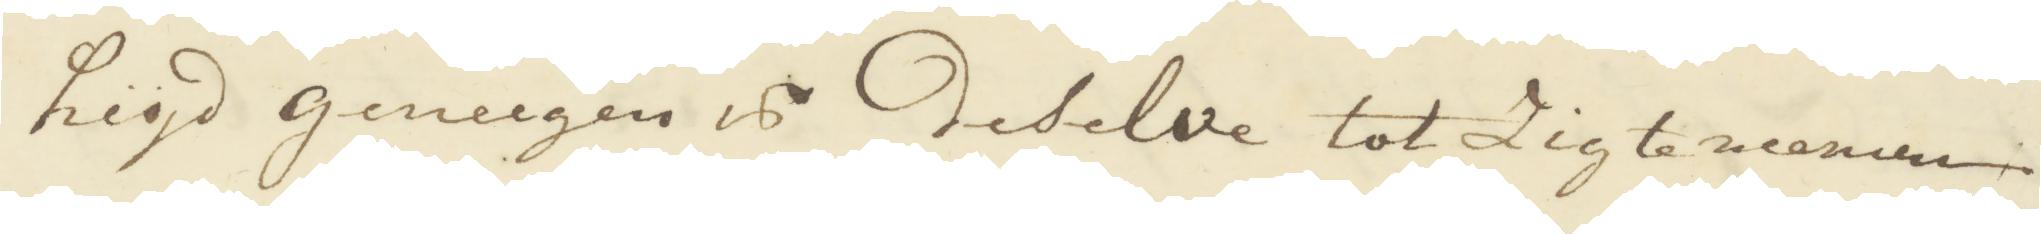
heijd geneegen is deselve tot zig te neemen
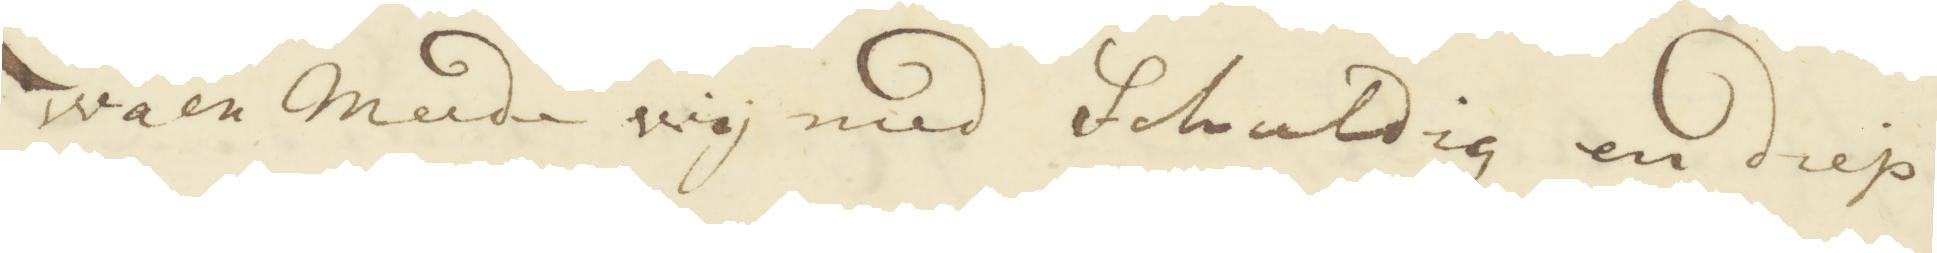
waer meede wij med schuldig en diep
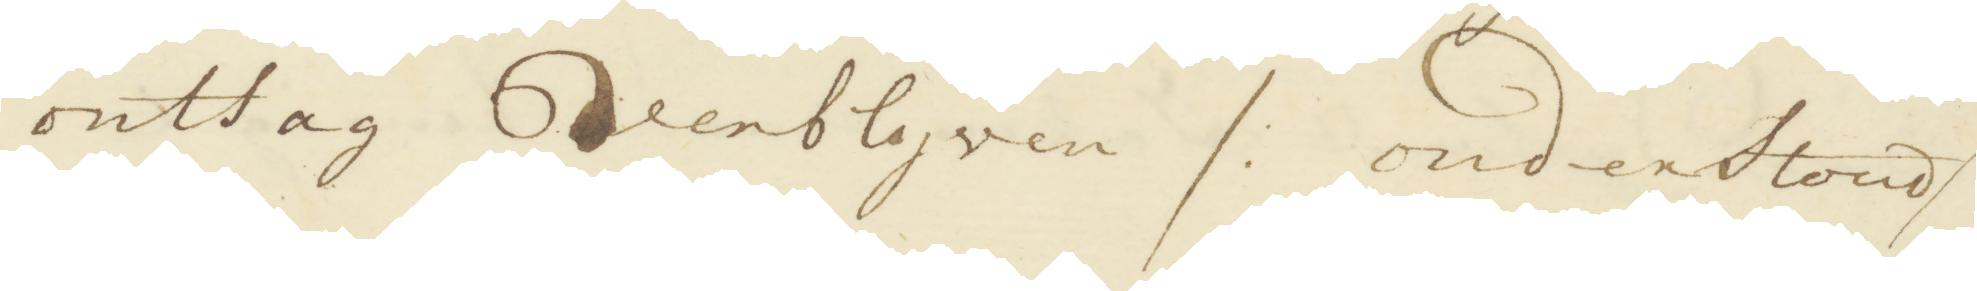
ontsag verblijven /: onderstond/
